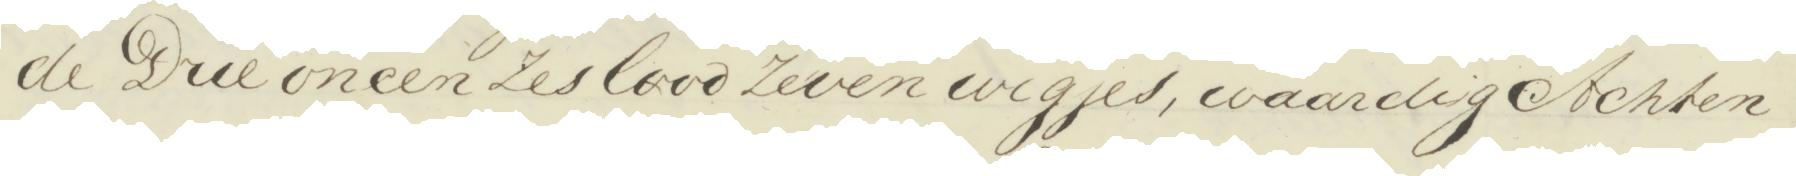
de Drie once en zes lood zeven wigjes, waardig Acht en
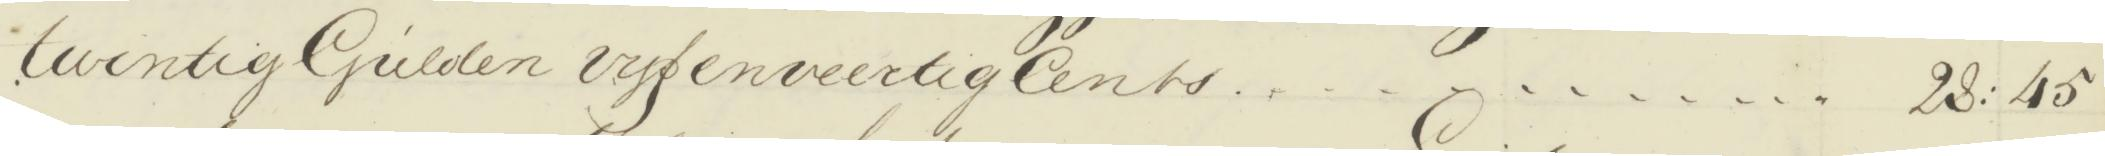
twintig Gulden vyf en veertig Cents. . . . . . . . . . . . . . . . „ 28:45
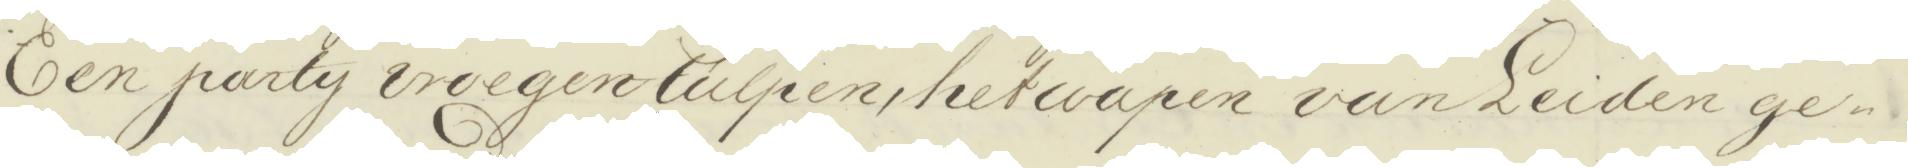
Een party vroegen tulpen, het wapen van Leiden ge„
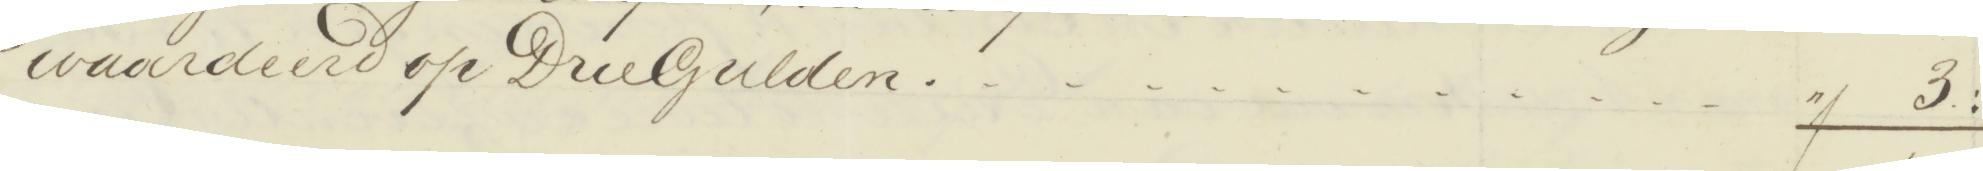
waardeerd op Drie Gulden . . . . . . . . . . . . . . „ 3.
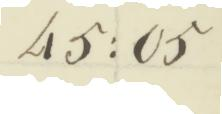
ƒ 45:05
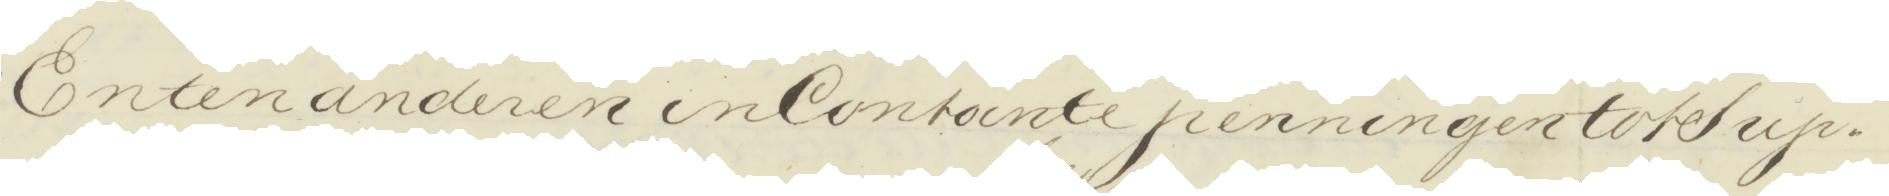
En ten anderen in Contante penningen tot sup„
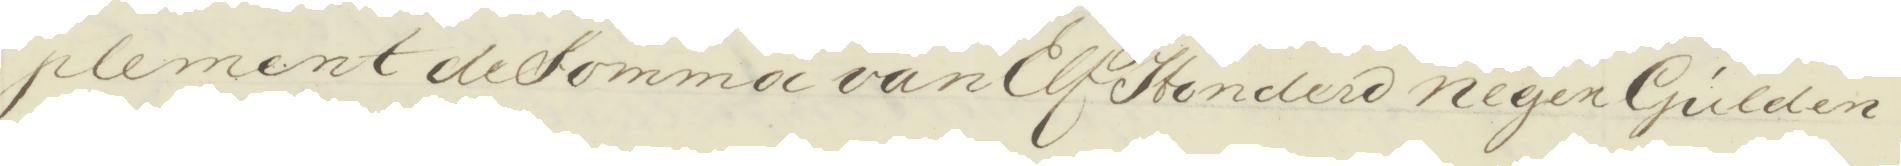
plement de Somma van Elf Honderd Negen Gulden
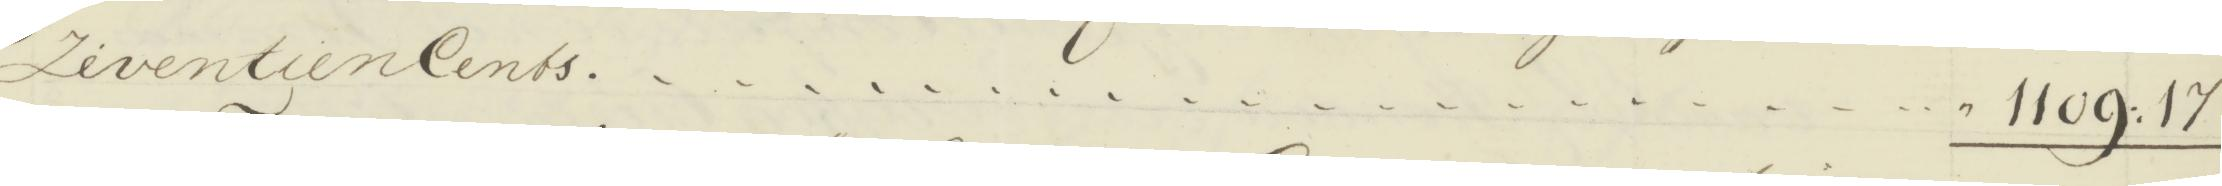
zeventien Cents. . . . . . . . . . . . . . . . . . . . . . . . „1109:17
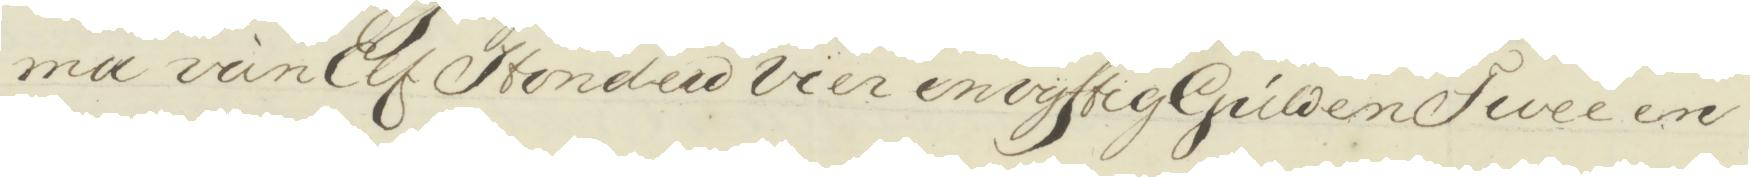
ma van Elf Honderd vier en vijftig Gulden Twee en
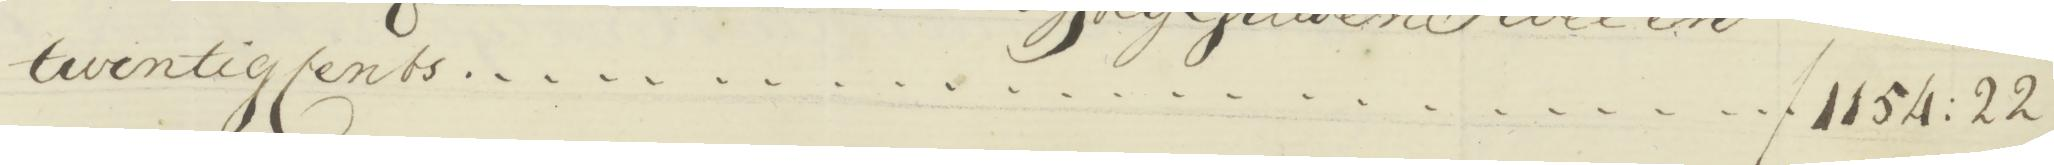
twintig Cents. . . . . . . . . . . . . . . . . . . . . . . . . ƒ 1154:22
